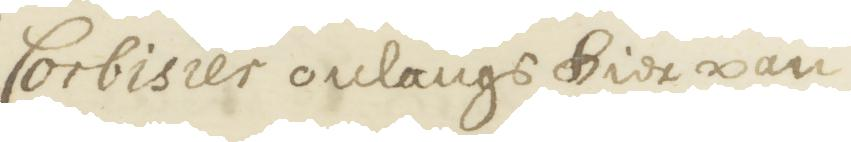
Corbisier onlangs hier van
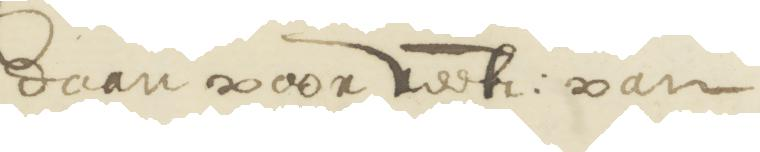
daan voor reek: van
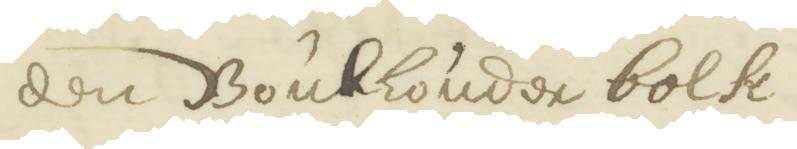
den Boukhouder bolk
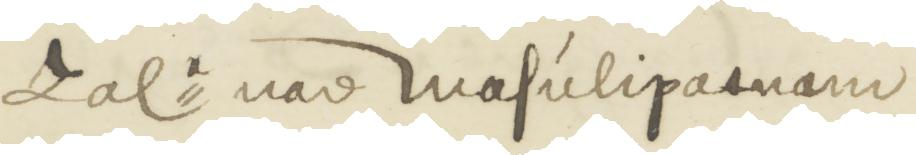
Zal„r nae masulipatnam
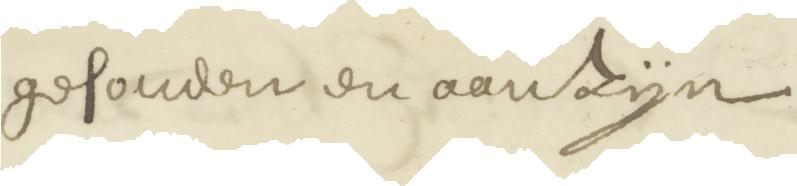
gesonden en aan Zijn
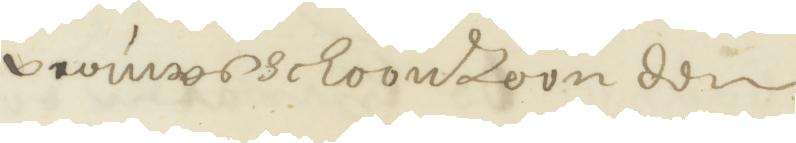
vrouws schoon Zoon den
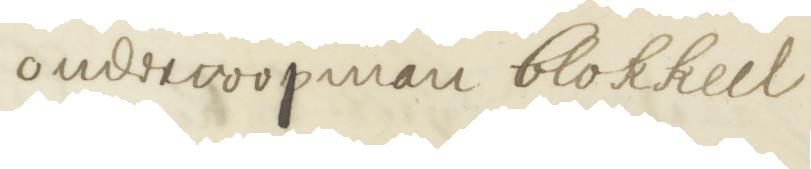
ondercoopman blokkeel
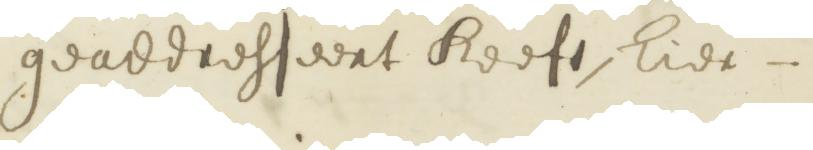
geaddresseert heeft, hier —
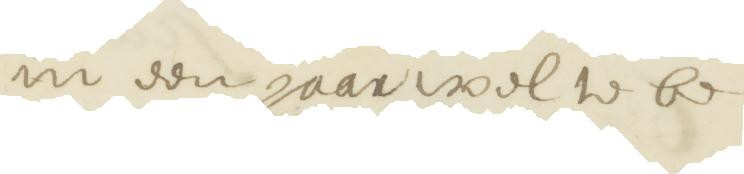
in een jaar wel te be
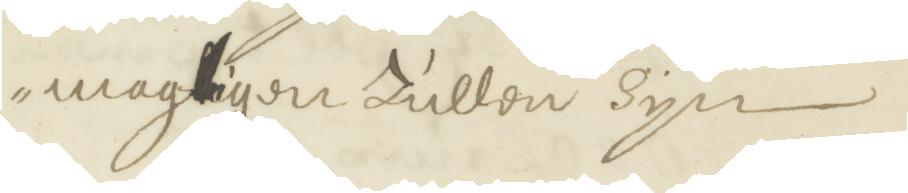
„magtigen Zullen Sijn
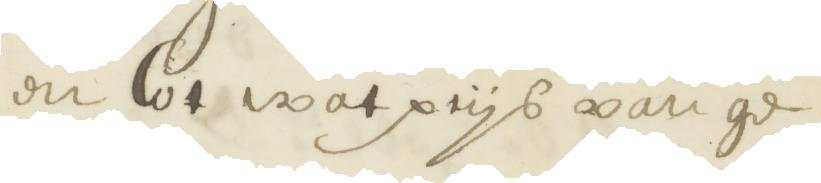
en tot wat prijs van ge
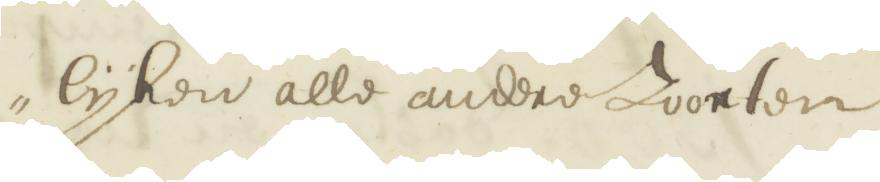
„lijken alle andere Zoorten
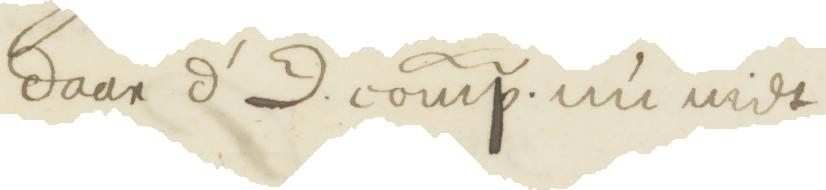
daar d’ E. comp: nu niet
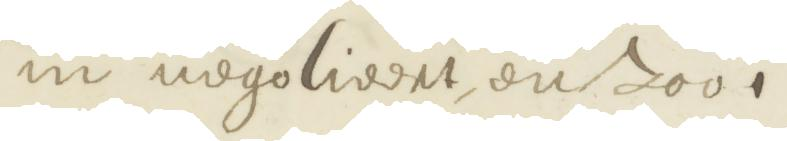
in negotieert, en Zoo 't
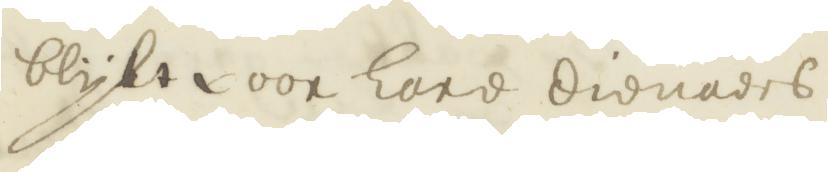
blijkt voor hare dienaers
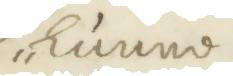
„hunne
